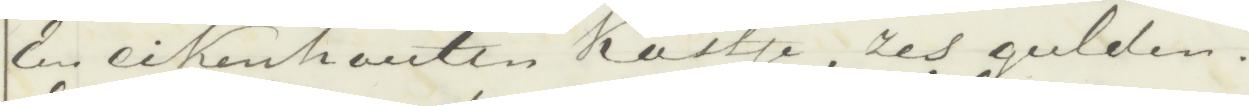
Een eikenhouten kastje, zes gulden
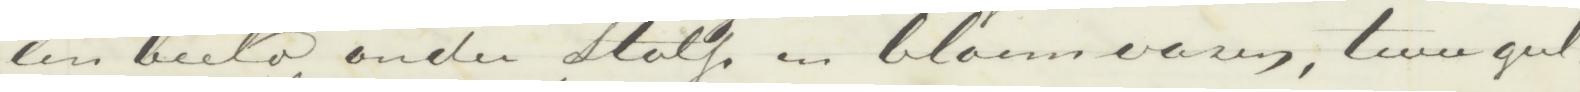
Een beeld onder stolp en bloem vazen, twee gul
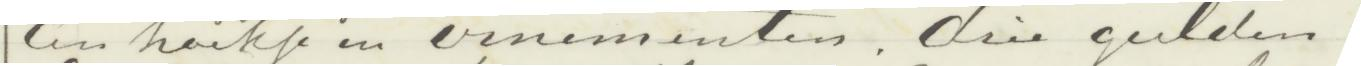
Een hoekje en ornamenten, drie gulden.
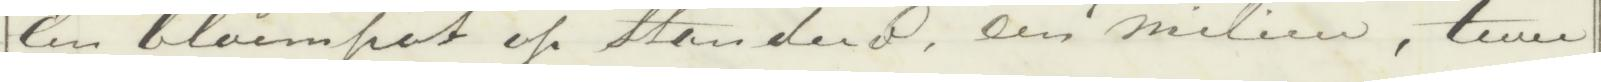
Een bloempot op standerd, een milieu, twee
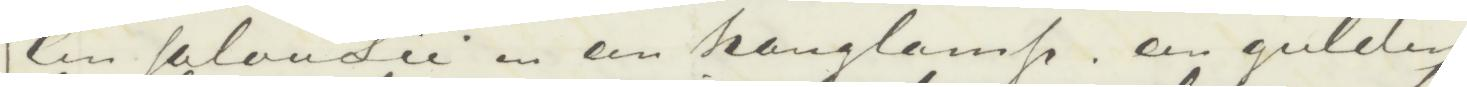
Een jalousie en een hanglamp, een gulden
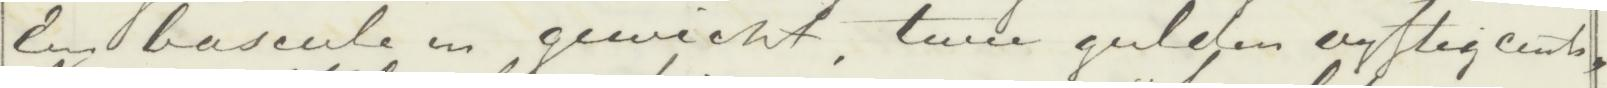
Een bascule en gewicht, twee gulden vyftig cents„
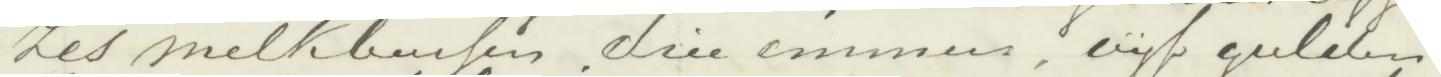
Zes melkbussen, drie emmers, vijf gulden
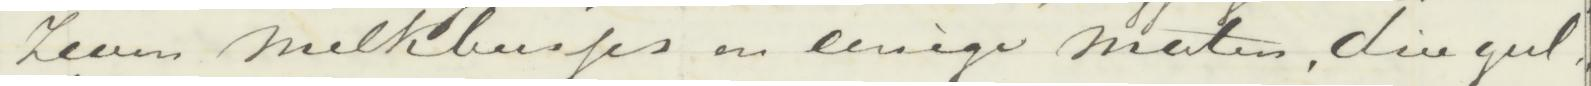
Zeven melkbusjes en eenige maten, drie gul„
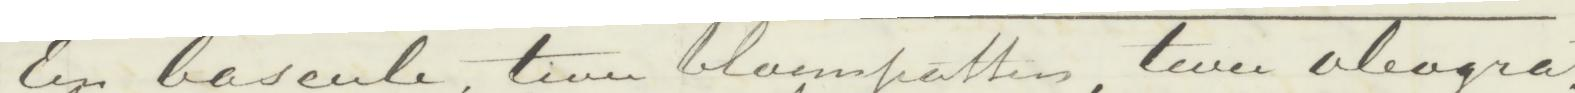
Een bascule, tien bloempotten, twee oleogra
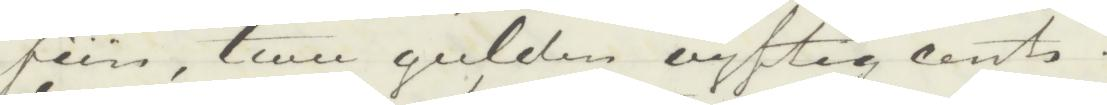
fiën, twee gulden vyftig cents.
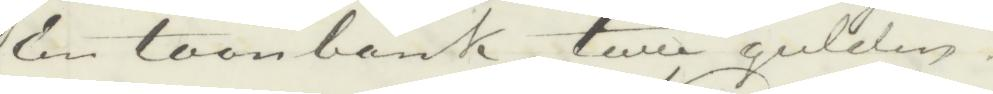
Een toonbank twee gulden
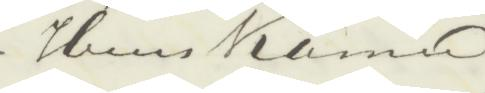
Huis kamer
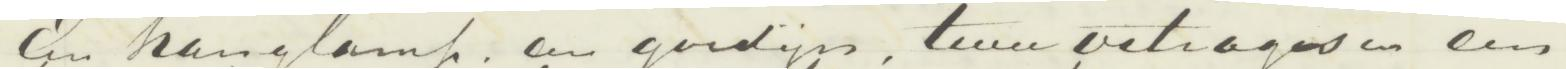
Een hanglamp, een gordijn, twee vitrages en een
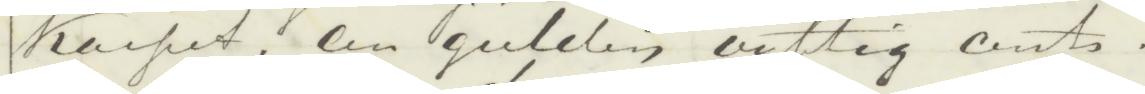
karpet, een gulden vyftig cents.
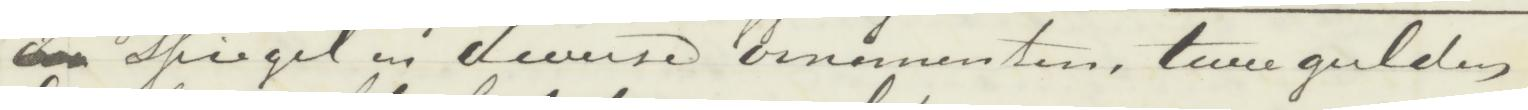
Een spiegel en diverse ornamenten, twee gulden
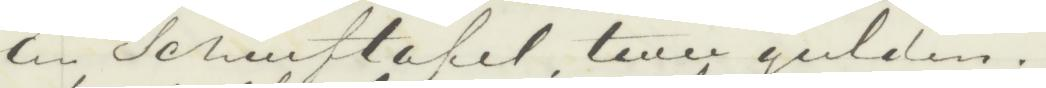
Een schuiftafel, twee gulden.
